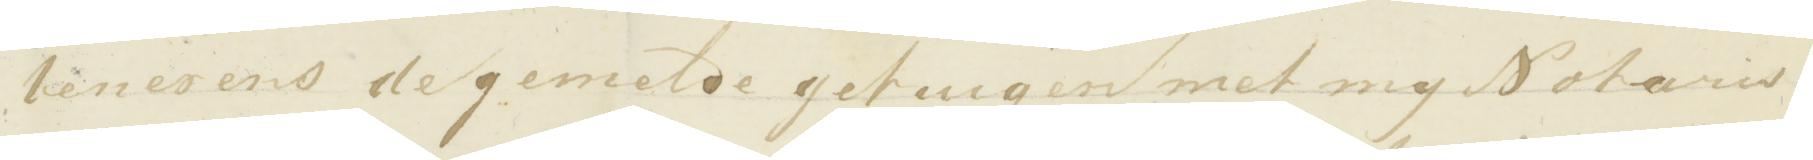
benevens de gemelde getuigen met my Notaris
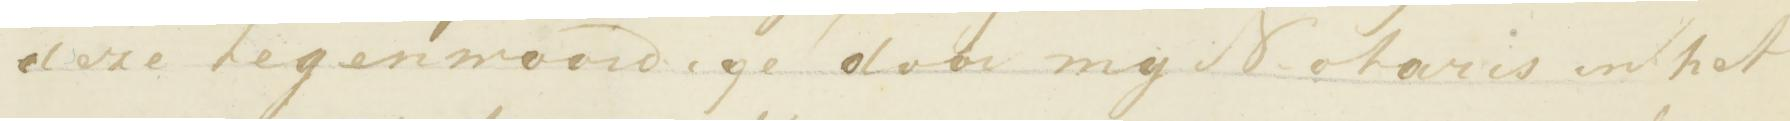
deze tegenwoordige door mij Notaris in het
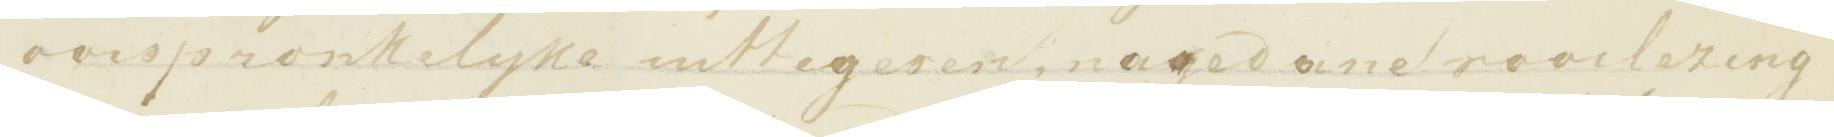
oorspronkelyke uittegeven, nagedane voorlezing
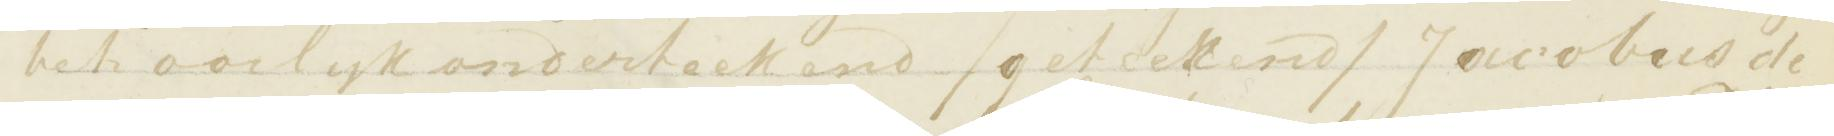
behoorlyk onderteekend / geteekend / Jacobus de
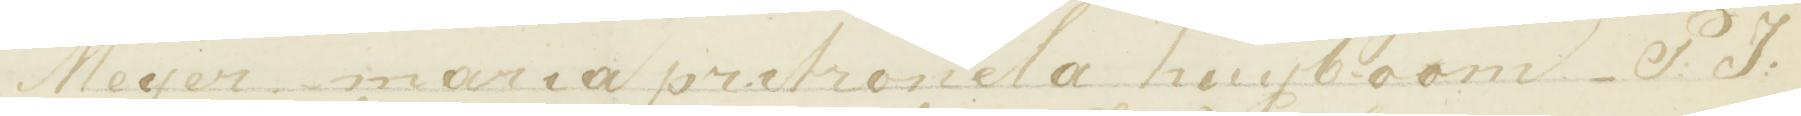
Meyer maria pretronela huyboom. — P: I:
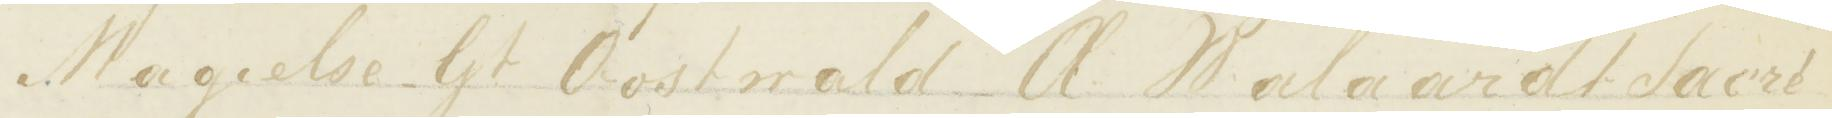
Mageelse — Gt Oostwald AE: Walaardt Sacré
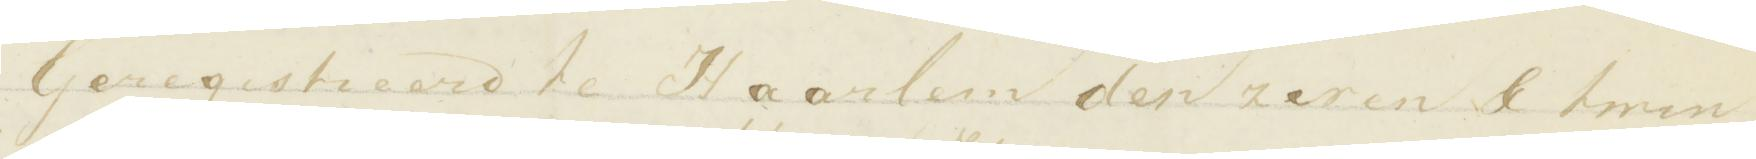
Geregistreerd te Haarlem den zeven & twin
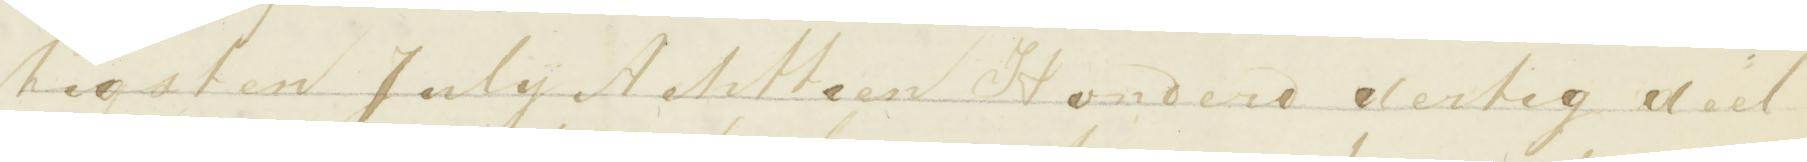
tigsten Julij Achttien Honderd dertig deel
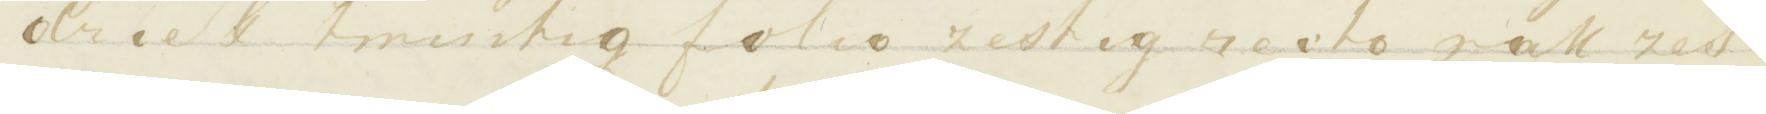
drie & twintig folio zestig recto vak zes
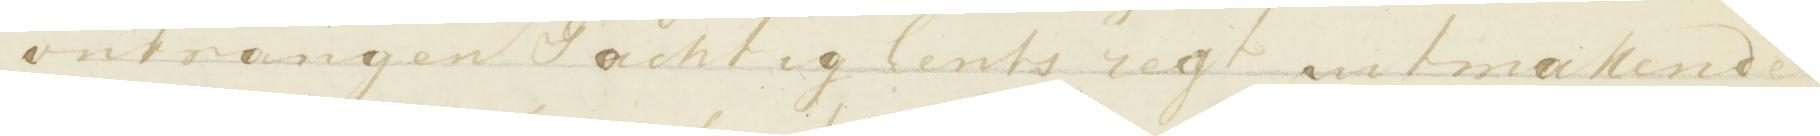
ontvangen Tachtig Cents regt uitmakende
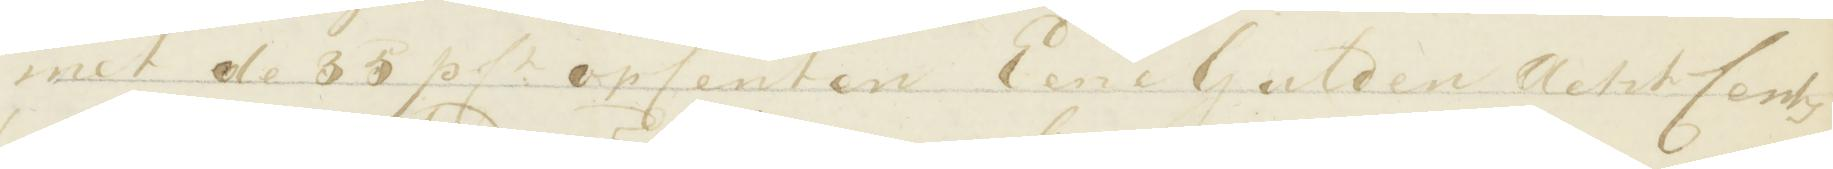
met de 35 pC:t opcenten Eene Gulden Acht Cent
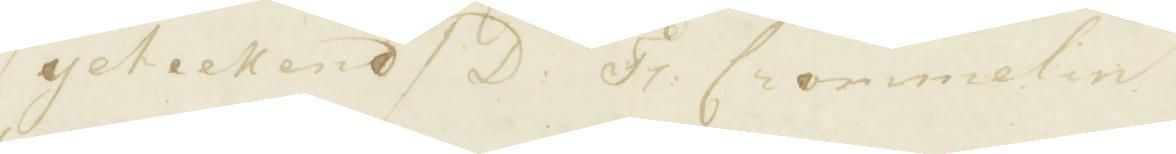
/ geteekend / D: F: Crommelin
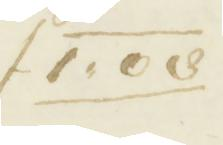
ƒ 1„08
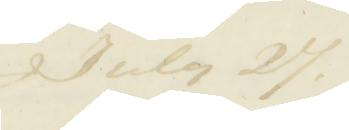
Iuly 27.
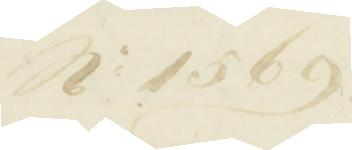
N:o 1569
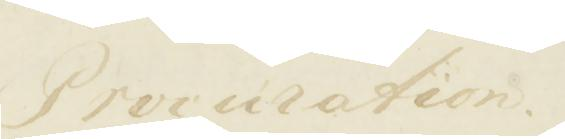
Procuration.
